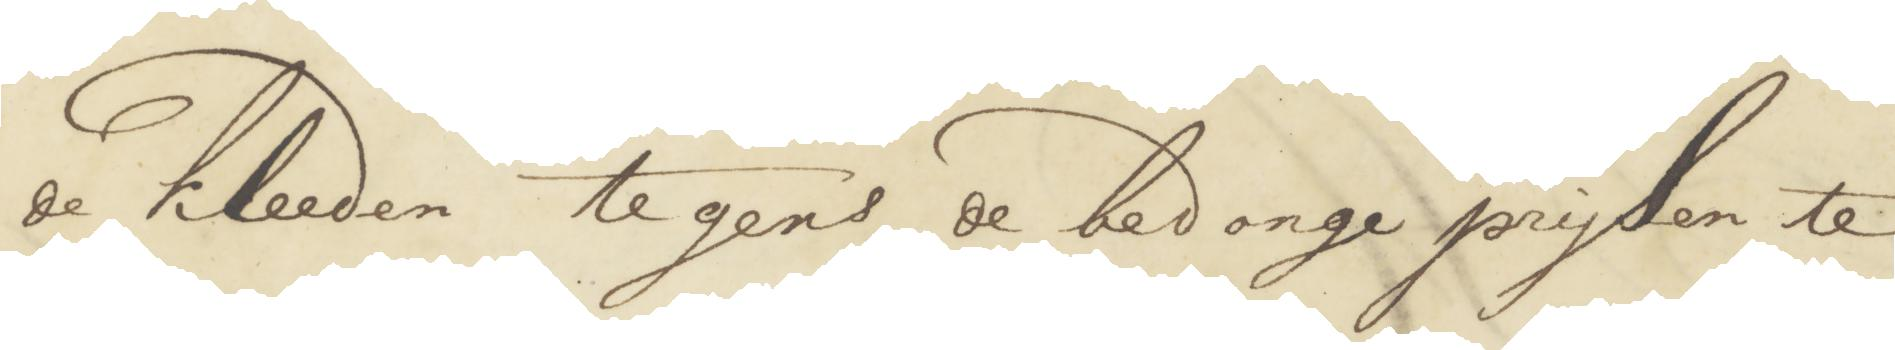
de kleeden tegens de bedonge prijsen te
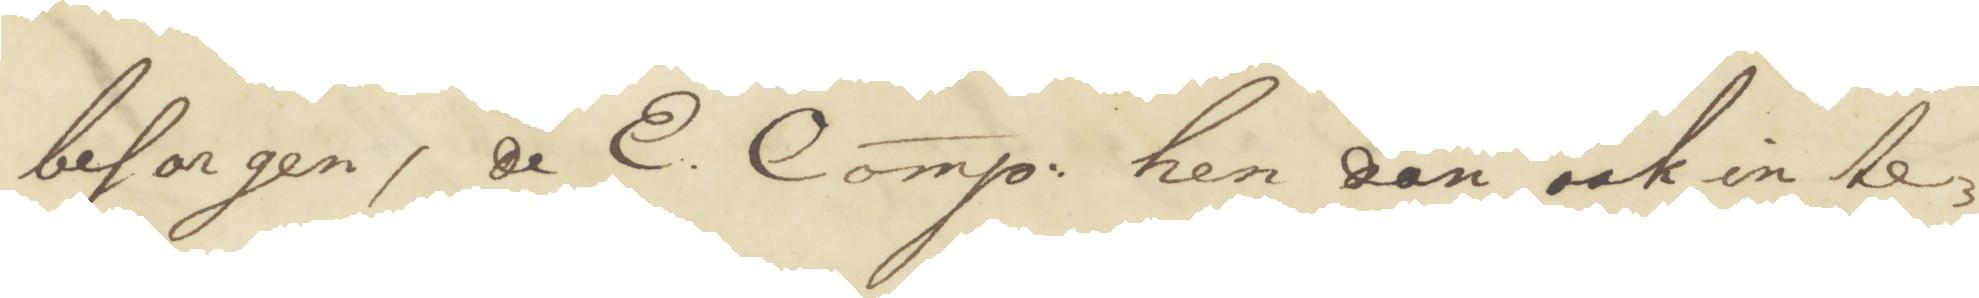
besorgen, de E: Comp: hen dan ook in te„
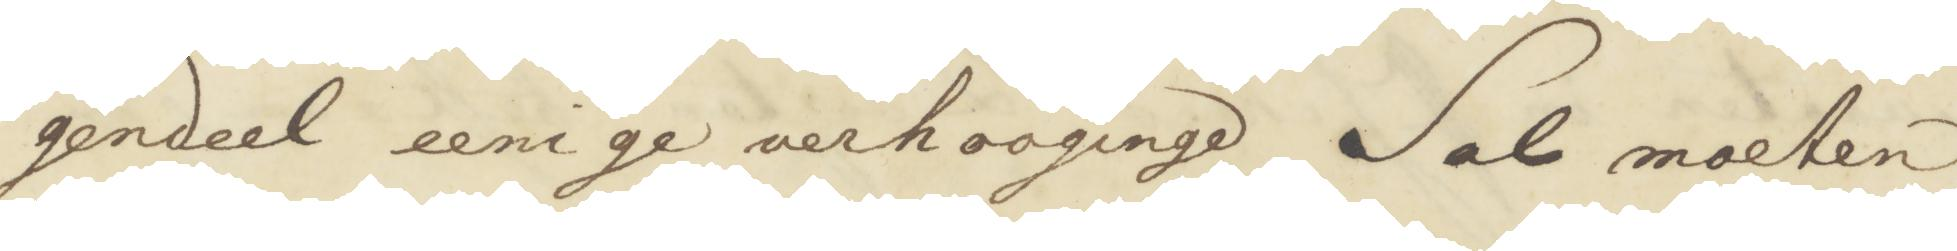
gendeel eenige verhooginge sal moeten
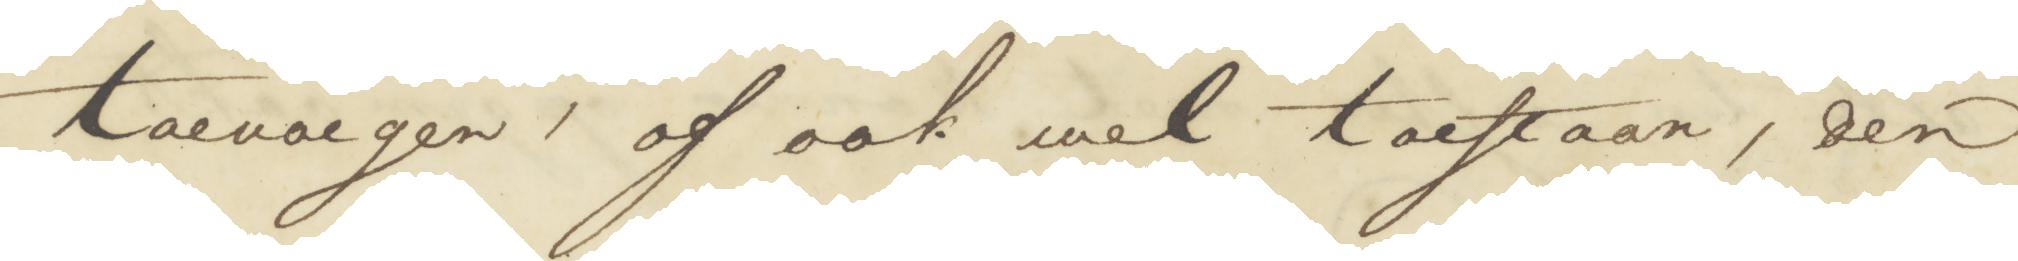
toevoegen, of ook wel toestaan, den
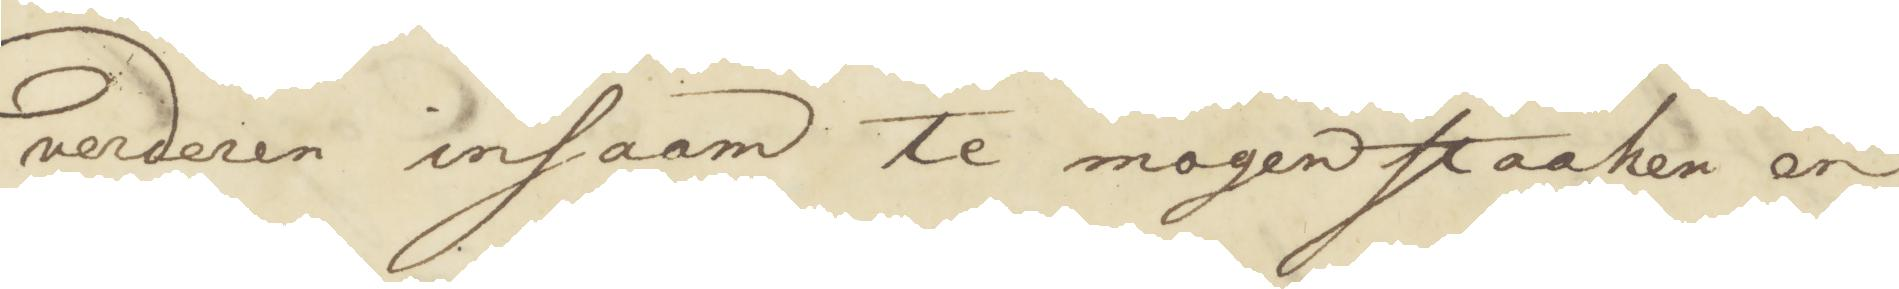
verderen insaam te mogen staaken en
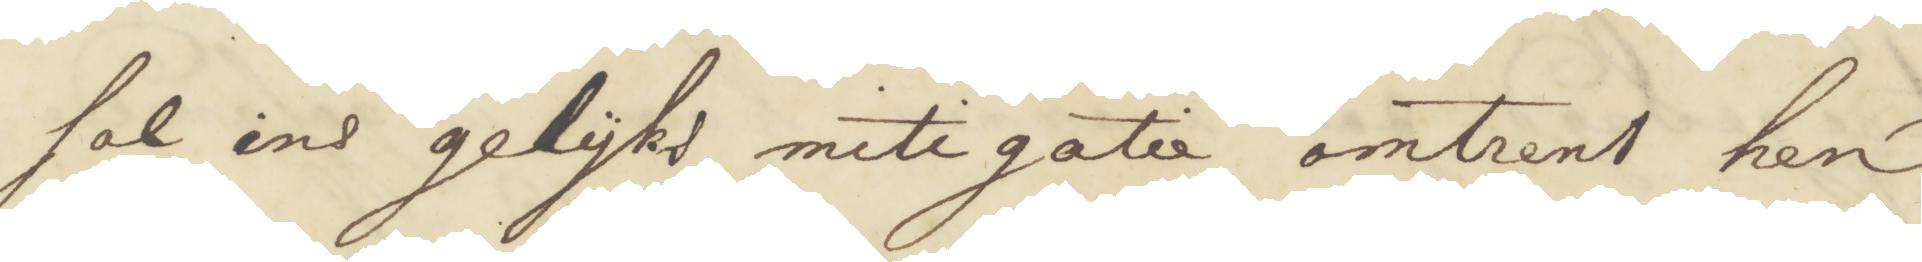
sal ins gelijks mitigatie omtrent hen
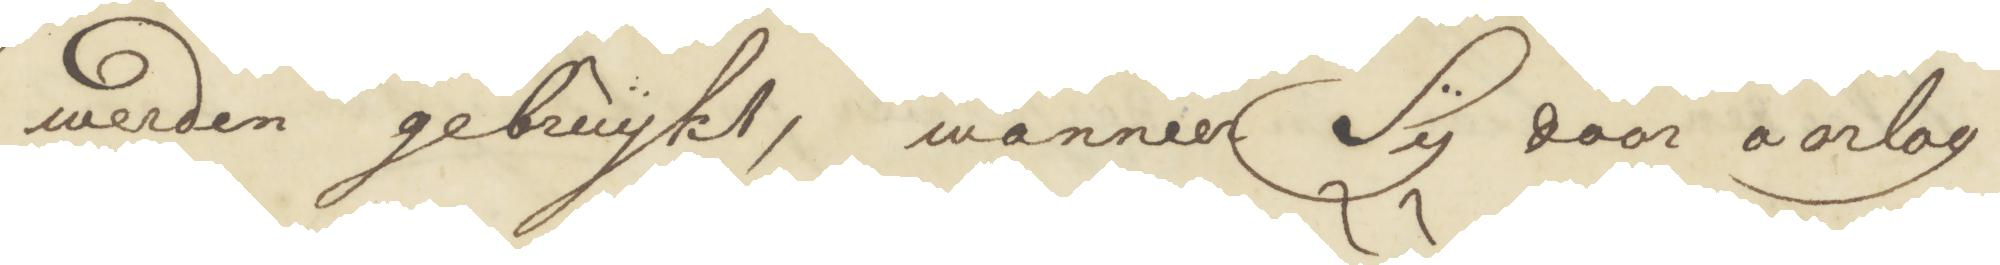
werden gebruijkt, wanneer sij door oorlog
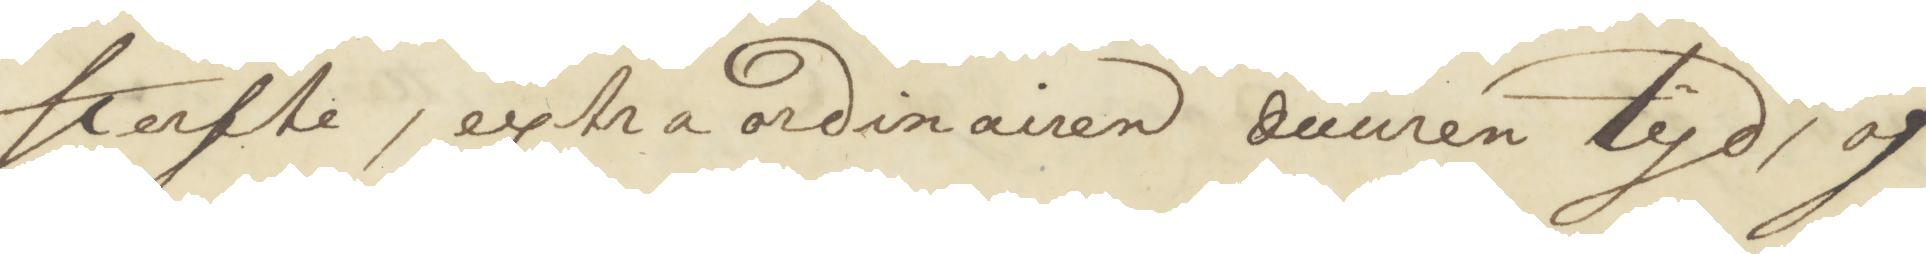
sterfte, extraordinairen duuren tijd, of
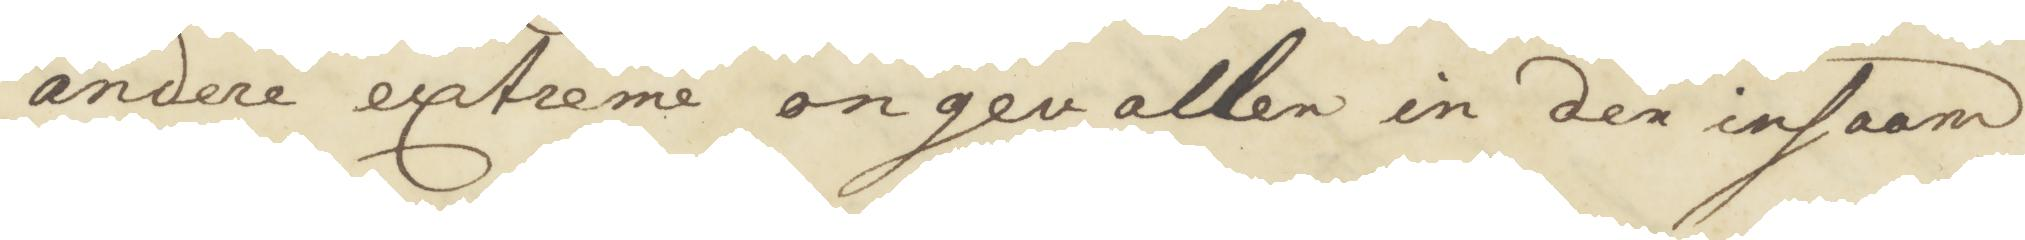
andere extreme ongevallen in der insaam
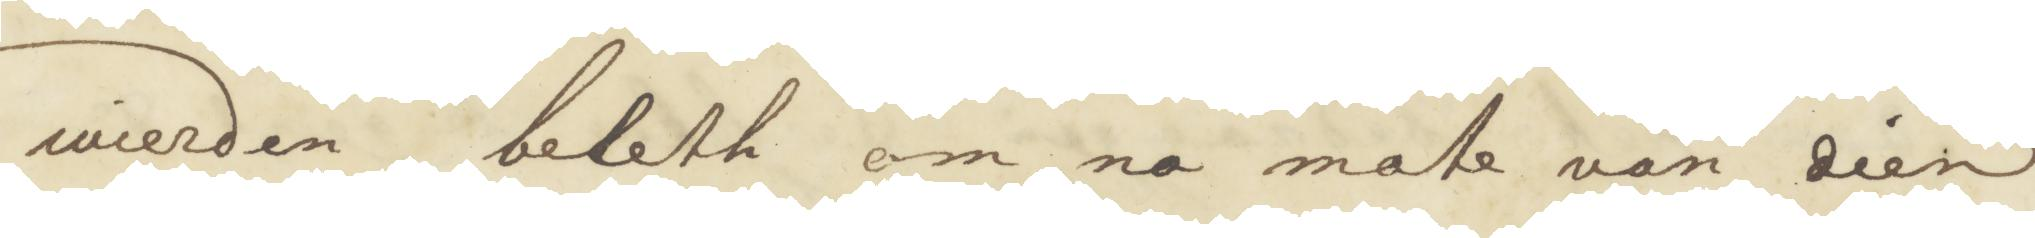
wierden beleth om na mate van dien
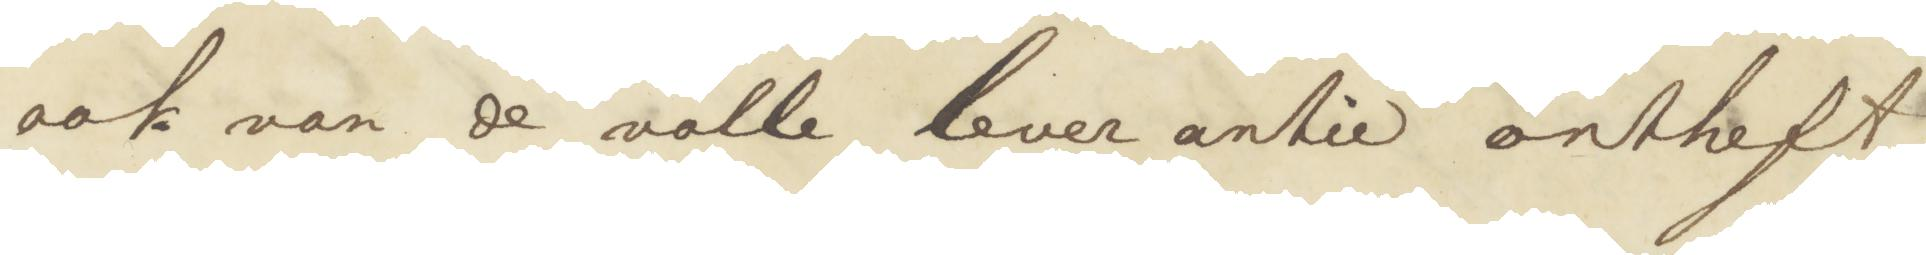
ook van de volle leverantie ontheft
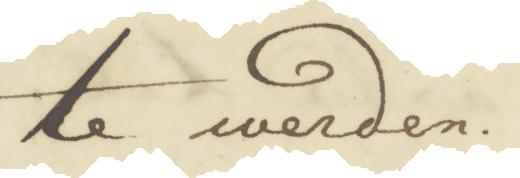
te werden.
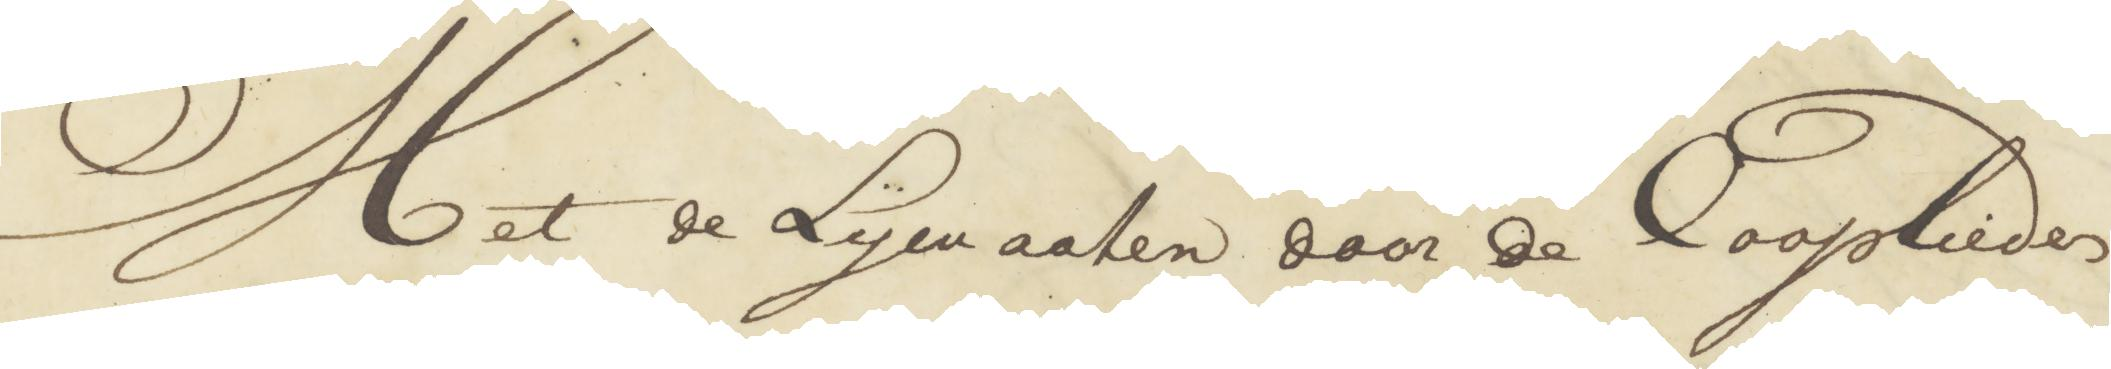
Met de lijwaaten door de Cooplieden
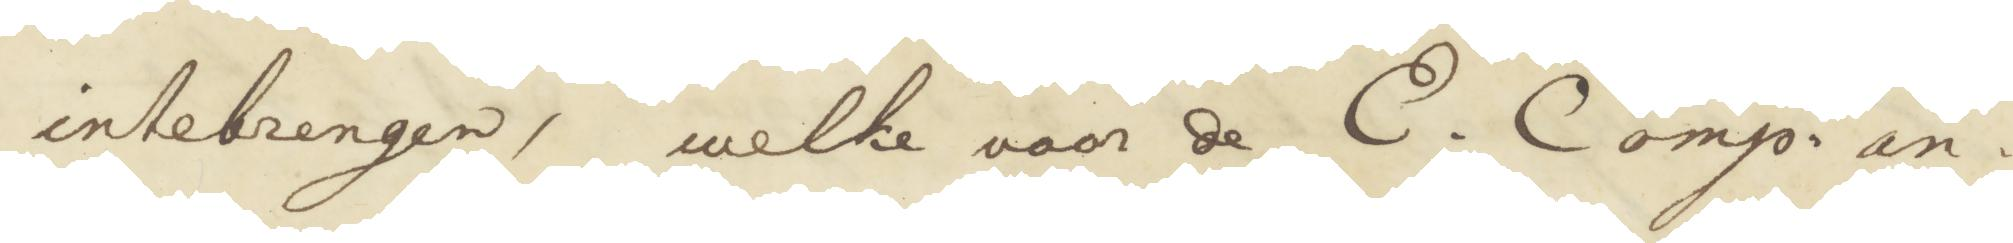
intebrengen, welke voor de E. Comp: on
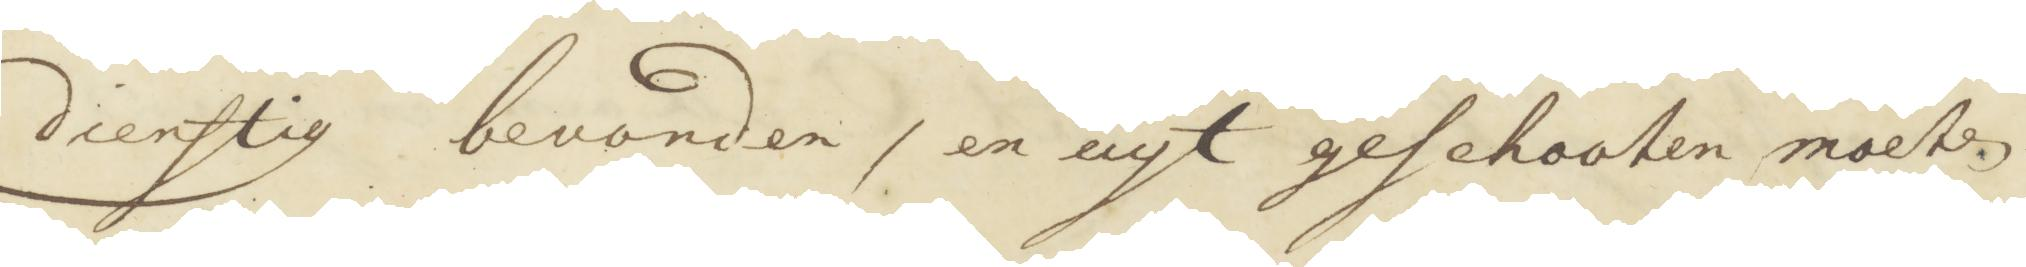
dienstig bevonden, en uijt geschooten moeten
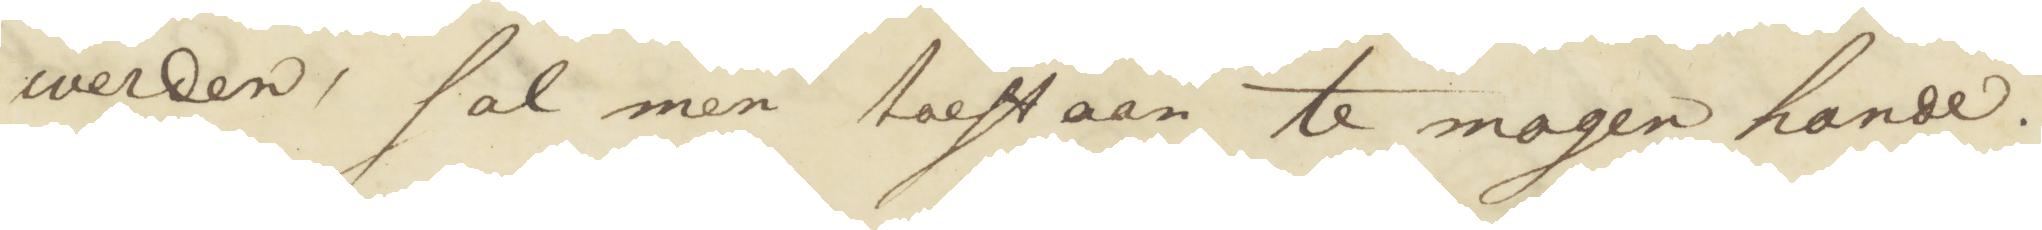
werden, sal men toestaan te mogen hande.
